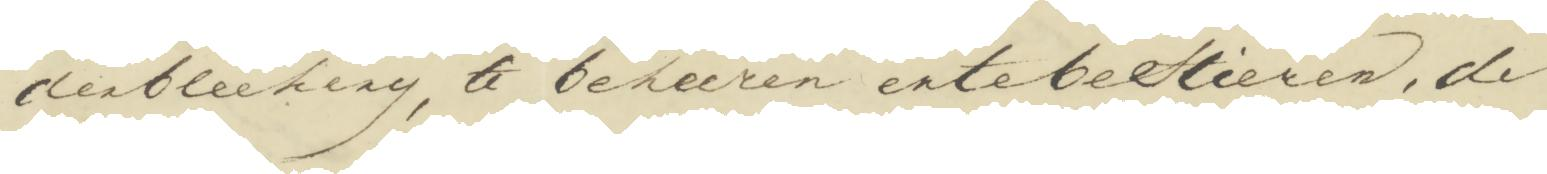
derbleekery, te beheeren ente bestieren, de
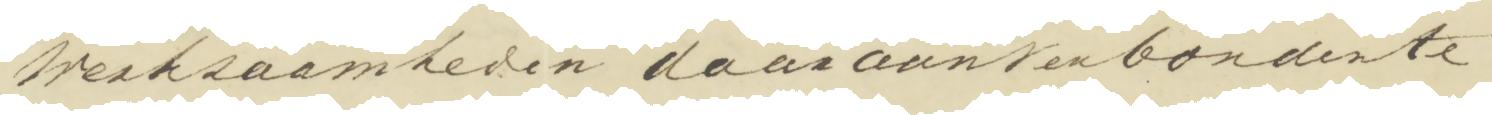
werkzaamheden daar aan verbonden te
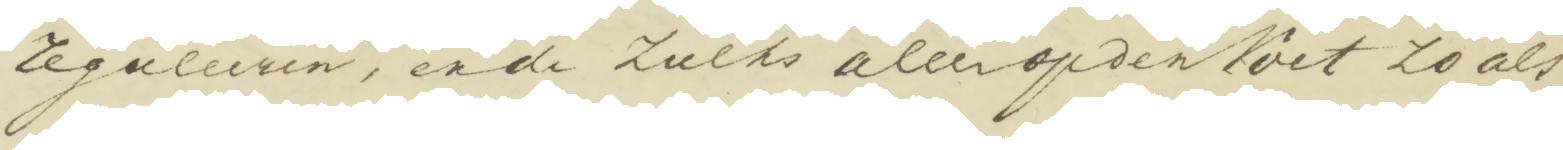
reguleeren, ende zulks alles op den voet zo als
